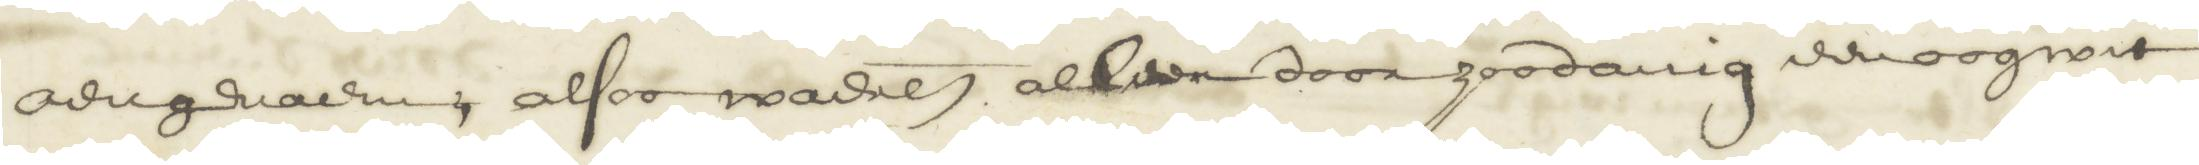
aengenaem, alsoo waerlijk alleer door zoodanig een oogwit
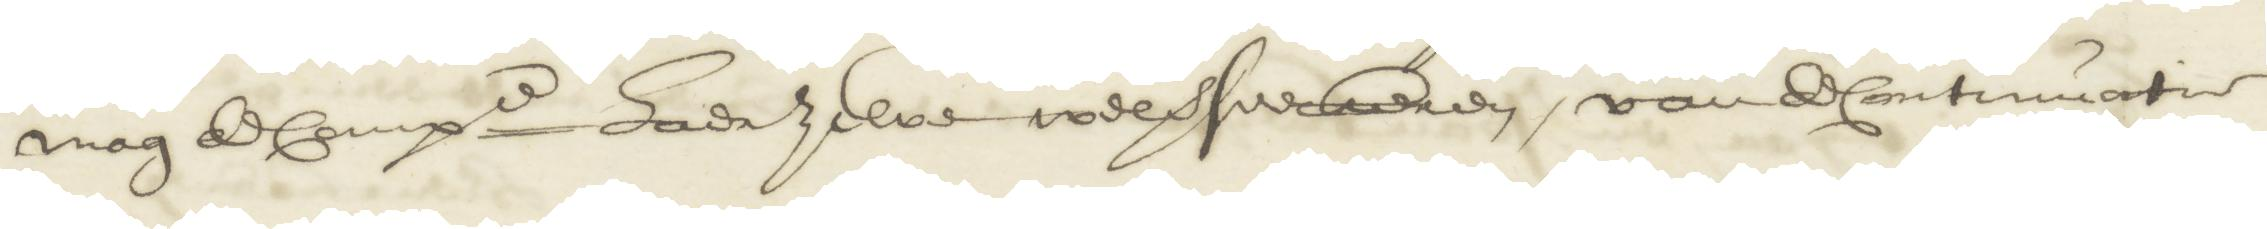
mag de Comp=e daer zelve wel verseeckeren, van de Continuatie
